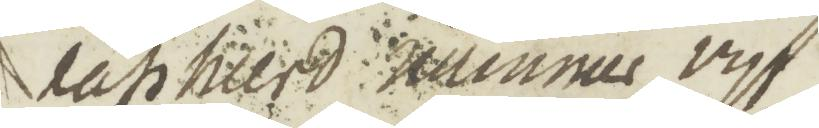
rapheerd nummer vyf
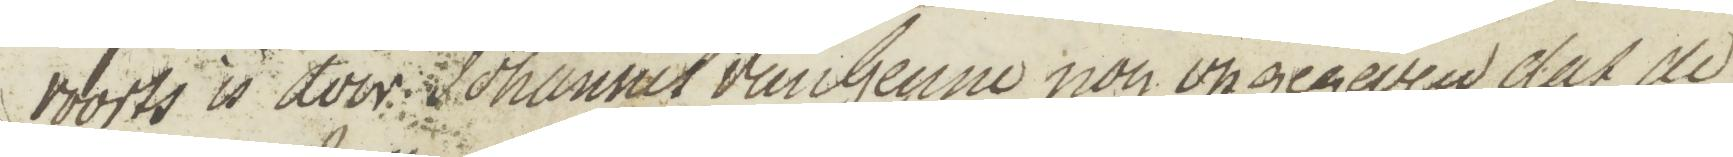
voorts is door Iohannes van Geune nog opgegeven dat de
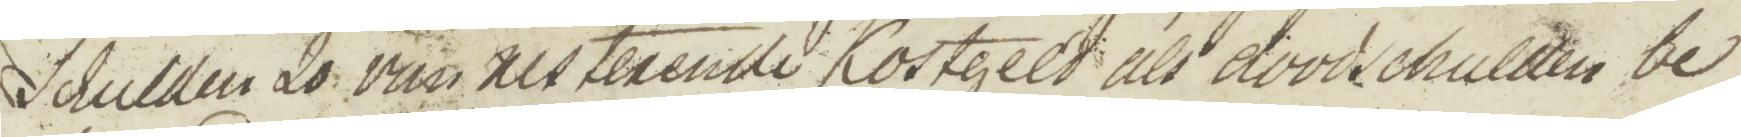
schulden Zo van resterende Kostgeld als doodschulden be
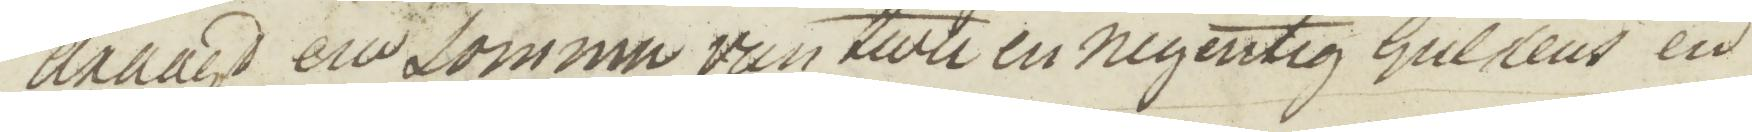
draagd en Somma van twee en negentig guldens en
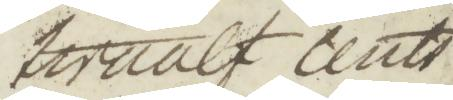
twaalf cents
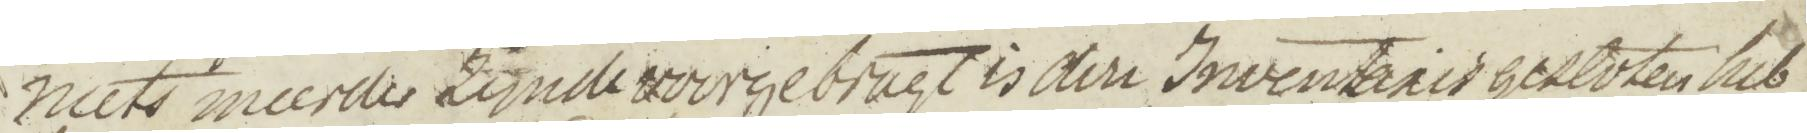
niets meerder Zynde voorgebragt is den Inventaris gesloten heb
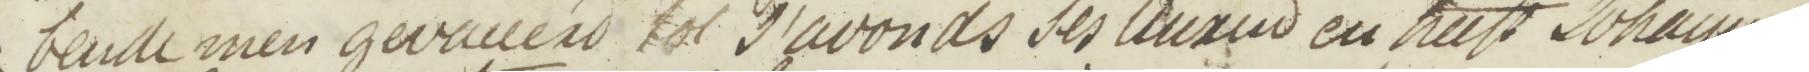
bende men gevaceerd tot s'avonds ses Uuren en heeft Iohannes
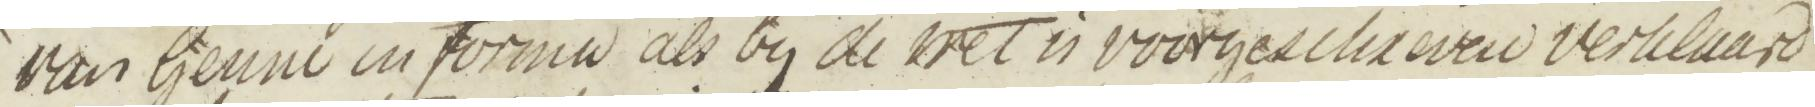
van Geune in forma als by de wet is voorgeschreven verklaard
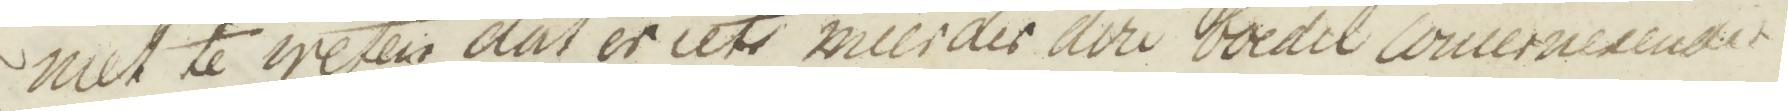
niet te weten dat er iets meerder deze boedel Concernerende
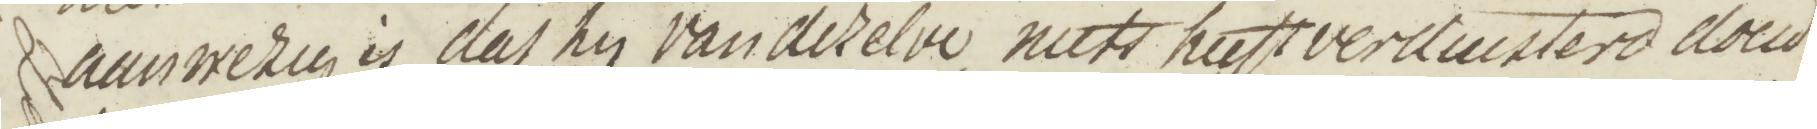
aanwezig is dat hy van dezelve niets heeft verduisterd doen
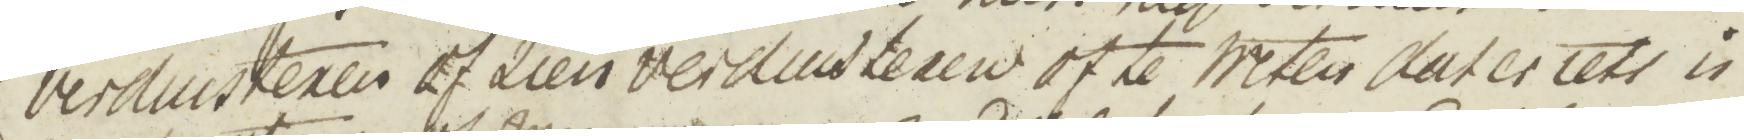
verduisteren of zien verduisteren of te weten dat er iets is
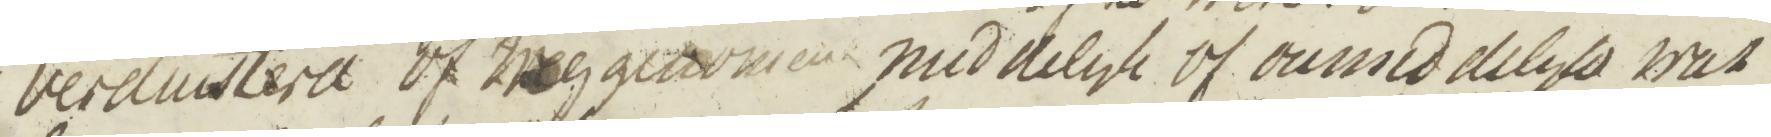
verduisterd of weg genomen middelyk of onmiddelyk wat
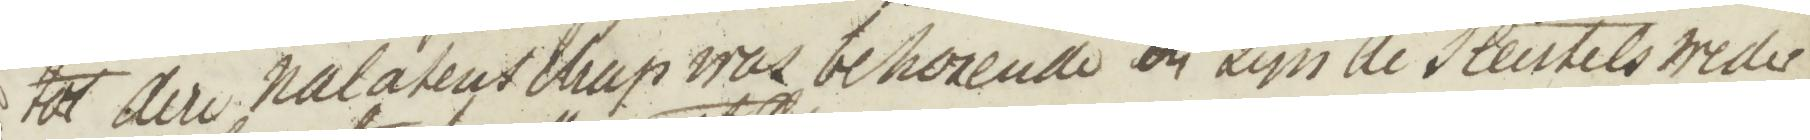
tot deze nalatenschap was behorende en Zyn de Sleutels weder
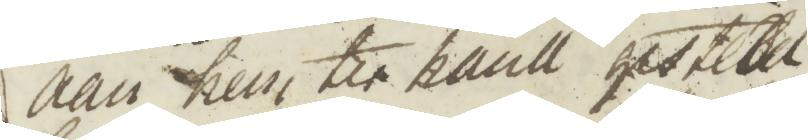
aan hem ter hand gesteld
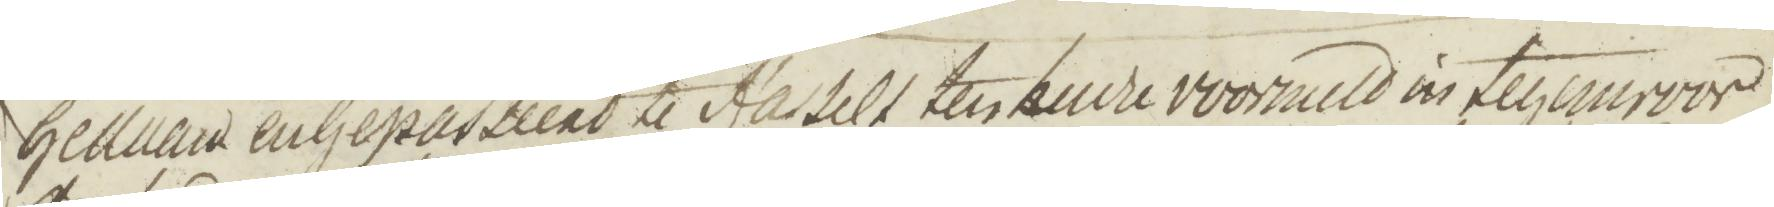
Gedaan en Gepasseerd te Hasselt ten huize voormeld in tegenvoor
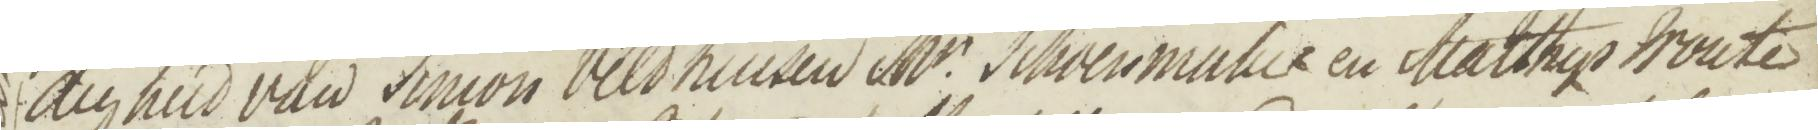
digheid van Simon Veldhuisen M:r Schoenmaker en Matthys Woute
